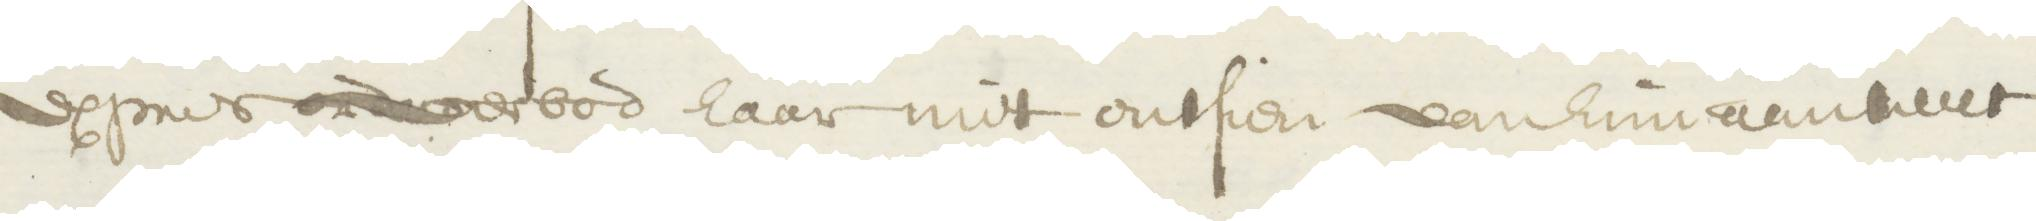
expres verbod haar niet ontsien van hun aanteert
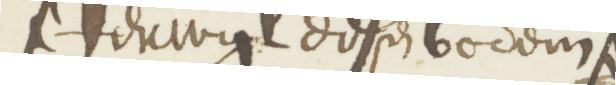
/ terwijl desen bodem /
